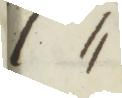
7 „
